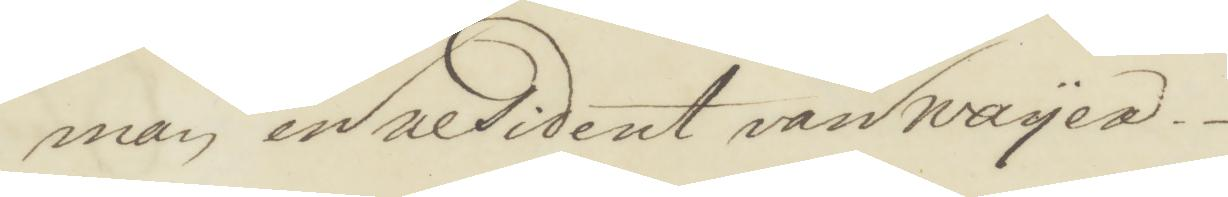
man en resident van waijer.-
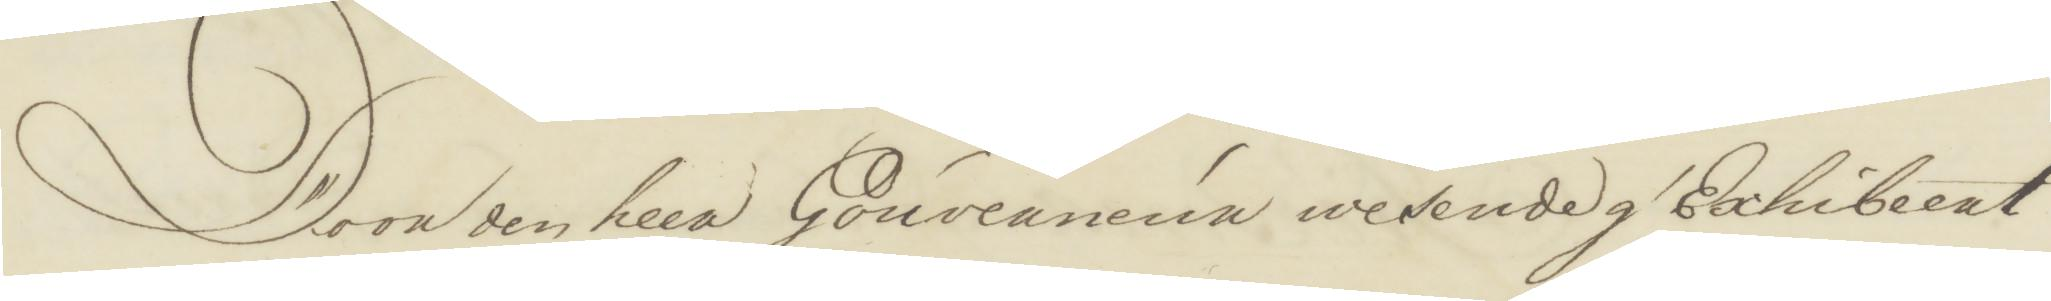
Door den heer Gouverneur wesende g’Exhibeert
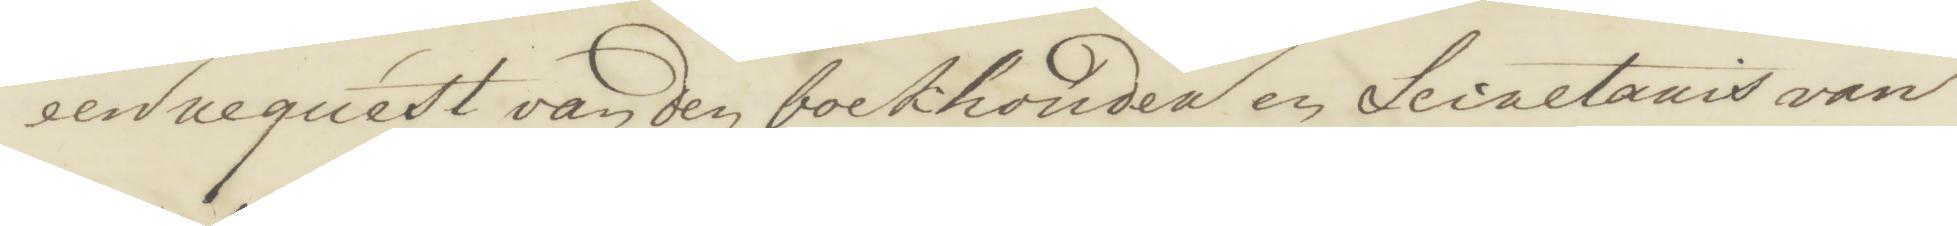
een request van den boekhouder en secretaris van
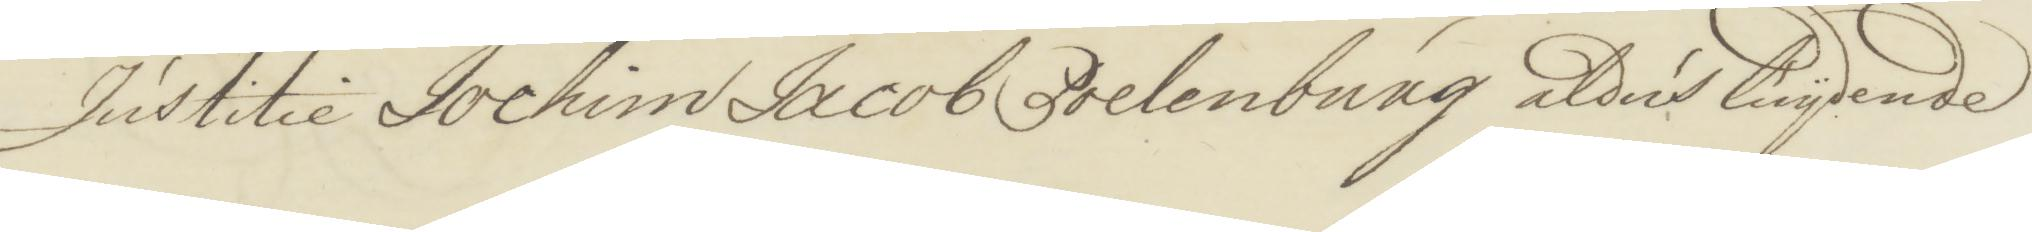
Justitie Iochim Iacob Poelenburg aldus luijdende
